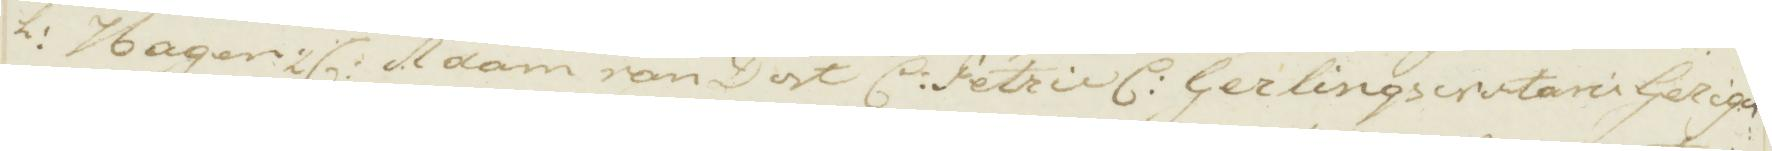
L: Hagen & C: Adam van Dort C: Petrie C: Gerlings Notaris Geregis
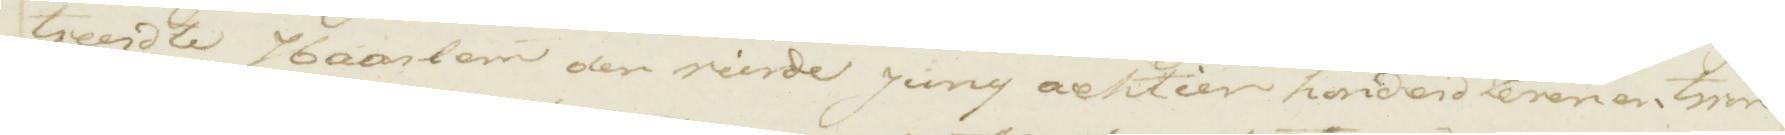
treerd te Haarlem der vierde Juny achtien honderd zeven en twin
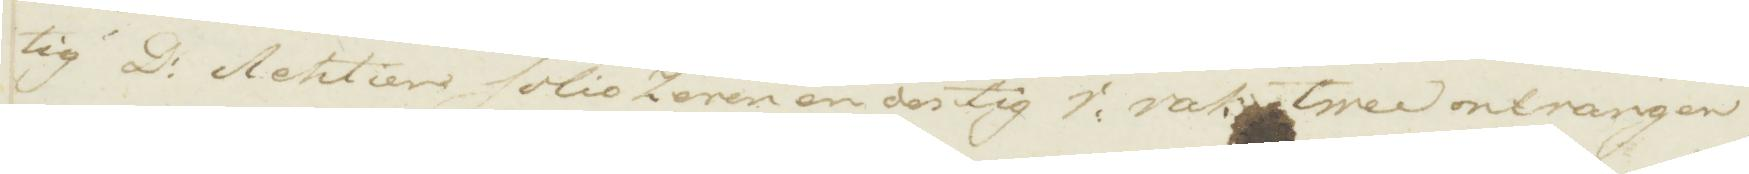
tig D: Achtien folio zeven en dertig v: vak twee ontvangen
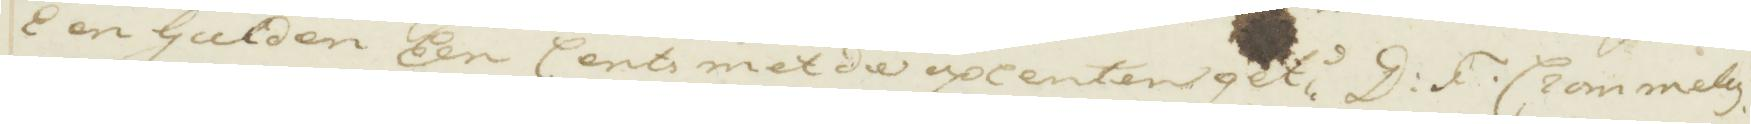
Een Gulden Een Cents met de opcenten get„' D:F: Crommelin
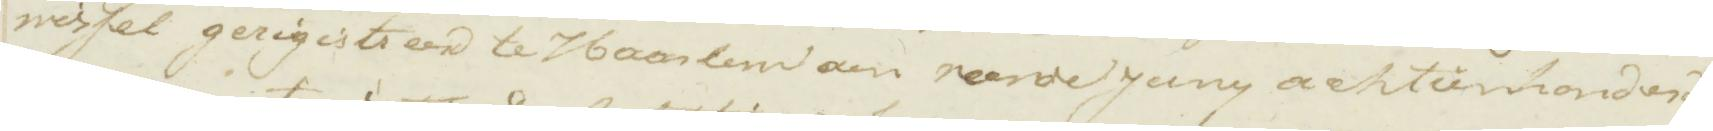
wissel gerigistreerd te Haarlem den veerde Juny achtienhonderd
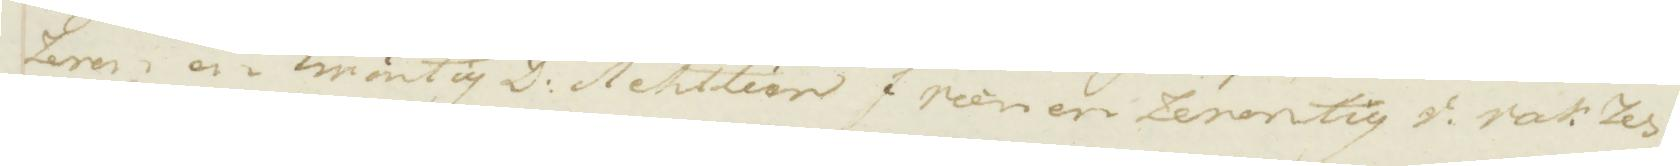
zeven en twintig D: Achttien vier en zeventig v. vak zes
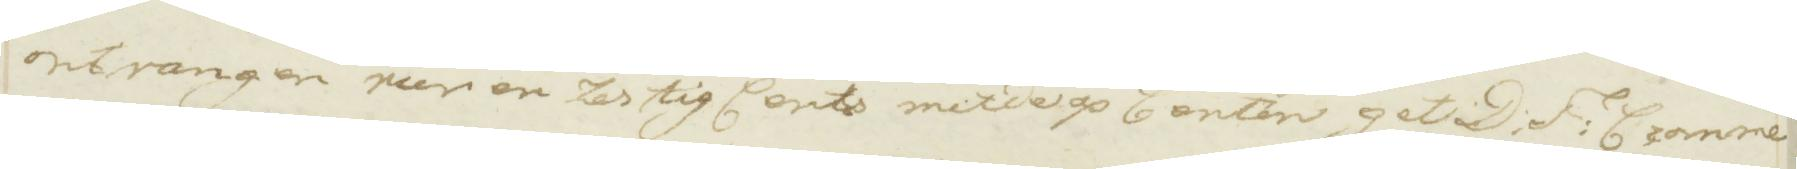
ontvangen vier en zestig Cents met de op Centen get D:F: Cromme
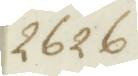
2636
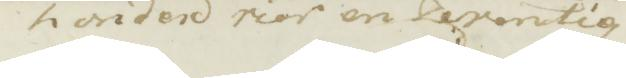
honderd vier en zeventig
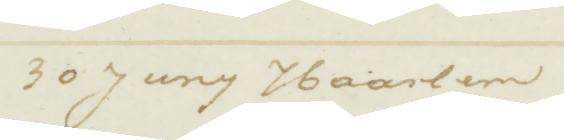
30 Juny Haarlem
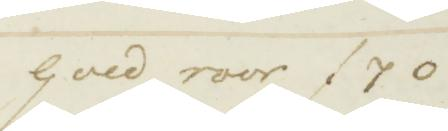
Goed voor ƒ70
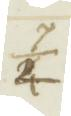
7/4
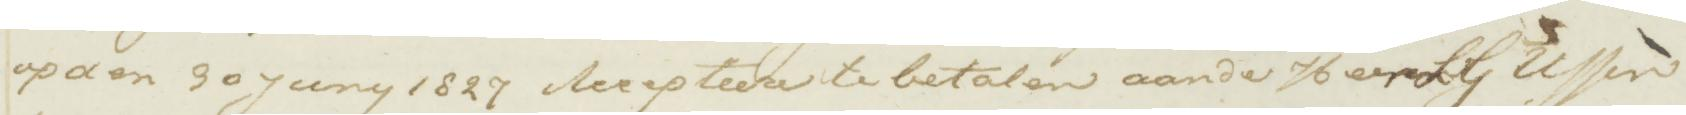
op den 30 Juny 1827 Accepteere te betalen aan de Heer LG Ussen
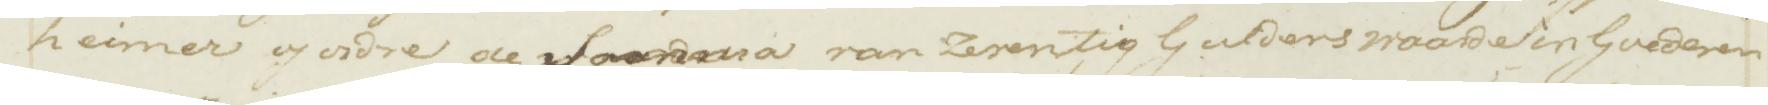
heimer op ordre de Somma van zeventig Guldens waarde in Goederen
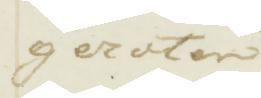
gezeten
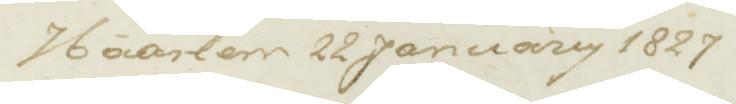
Haarlem 22 January 1827
